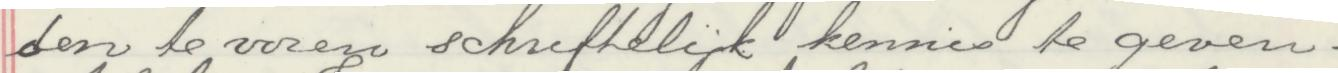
den te voren schriftelijk kennis te geven
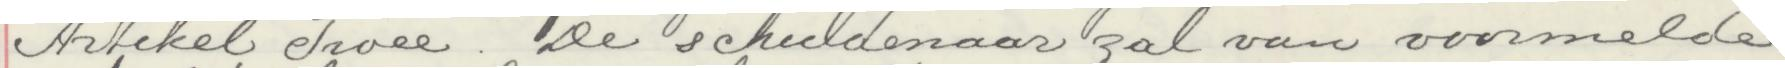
Artikel Twee. de schuldenaar zal van voormelde
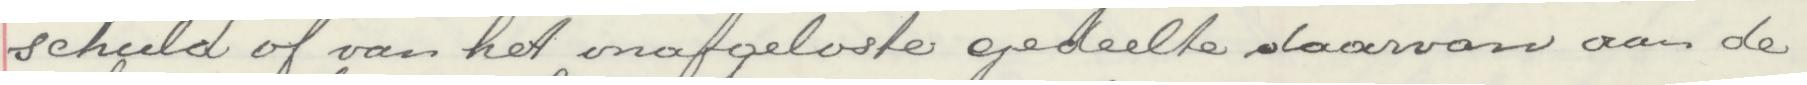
schuld of van het onafgeloste gedeelte daarvan aan de
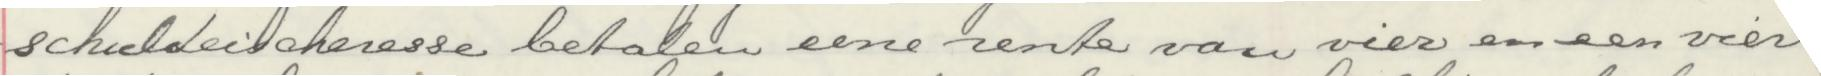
schuldeischeresse betalen eene rente van vier en een vier
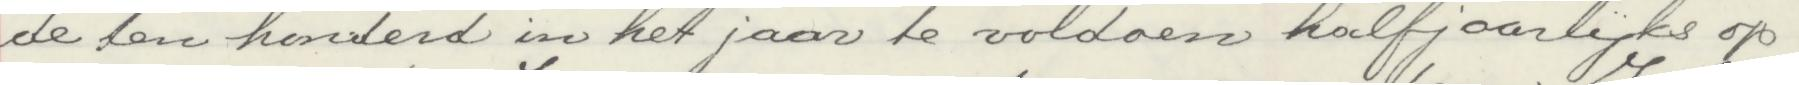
de ten honderd in het jaar te voldoen halfjaarlijks op
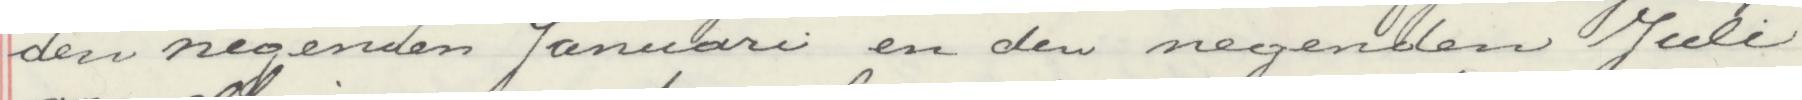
den negenden Januari en den negenden Juli
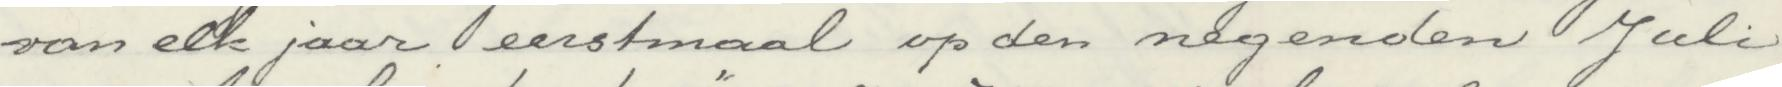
van elk jaar eerstmaal op den negenden Juli
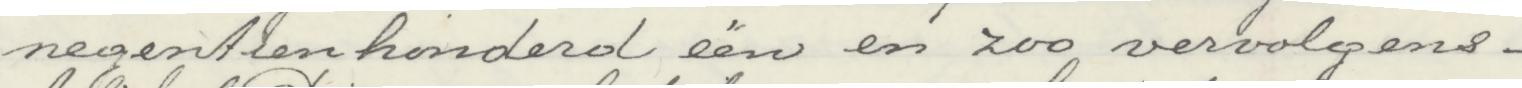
negentien honderd een en zoo vervolgens
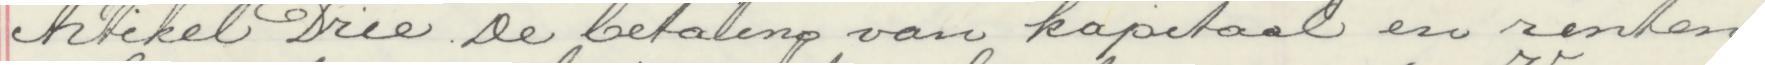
Artikel Drie De betaling van kapitael en renten
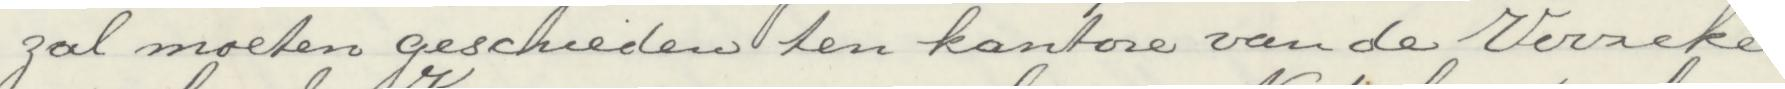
zal moeten geschieden ten kantore van de Verzeke
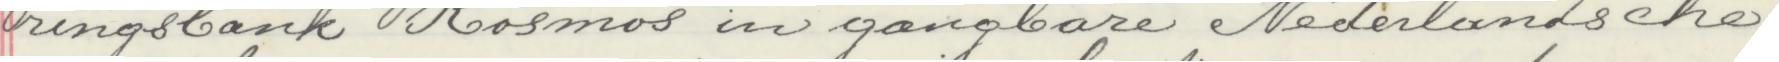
ringsbank Kosmos in gangbare Nederlandsche
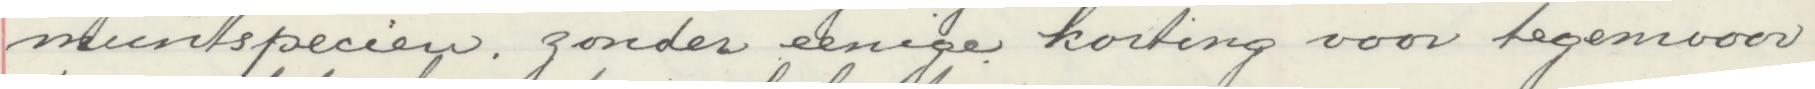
muntspecien, zonder eenige korting voor tegenvoor
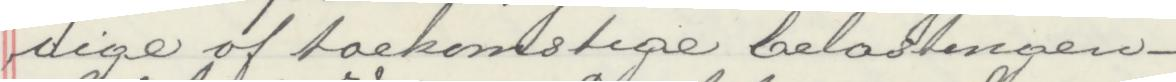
dige of toekomstige belastingen
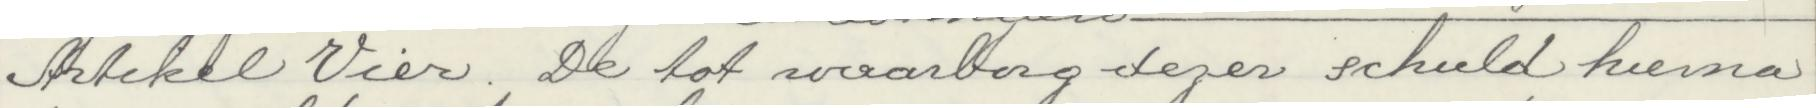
Artikel Vier. De tot waarborg dezer schuld hierna
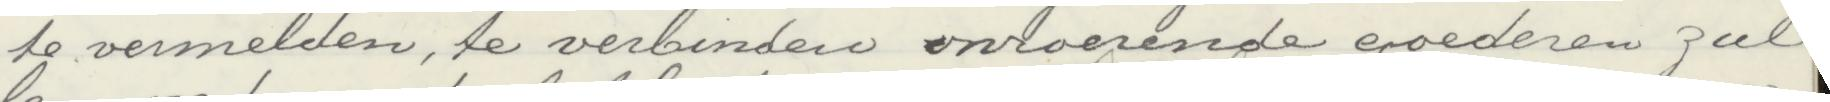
te vermelden, te verbinden onroerende goederen zul
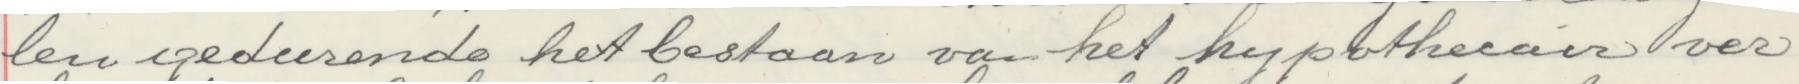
ten gedurende het bestaan van het hypothecair ver
